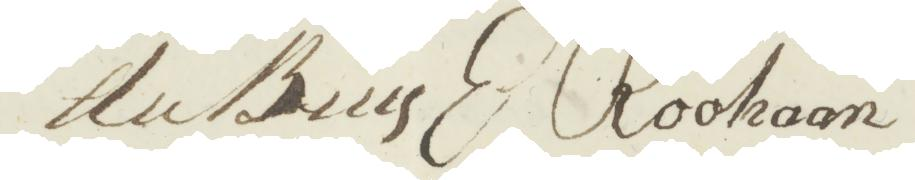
J: du Buy E Roohaan
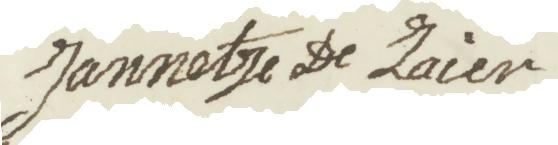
Jannetje De Zaier
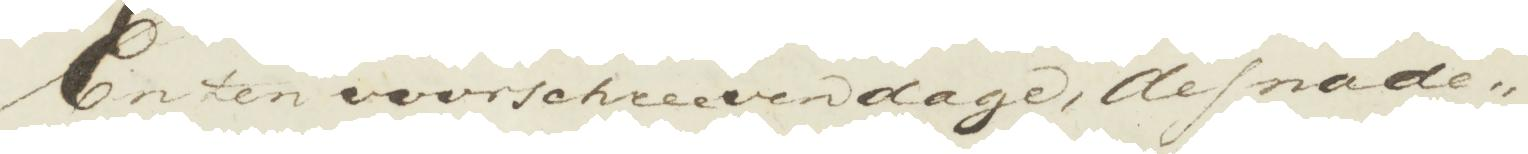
En ten voorschreeven dage, des nade„
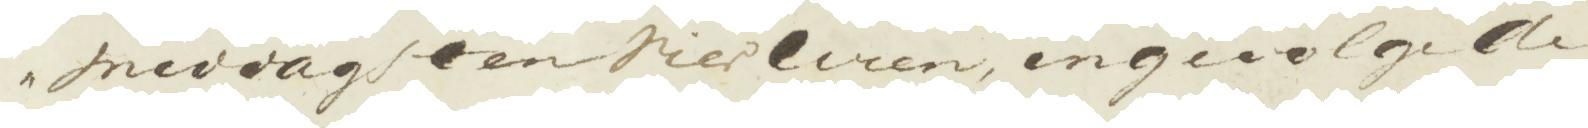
„ middags ten vier Uren, ingevolge de
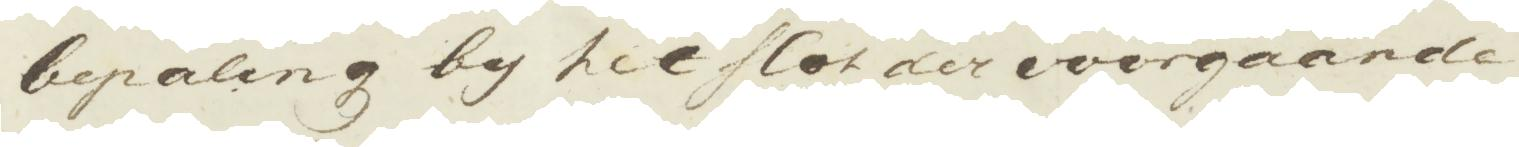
bepaling by het slot der voorgaande
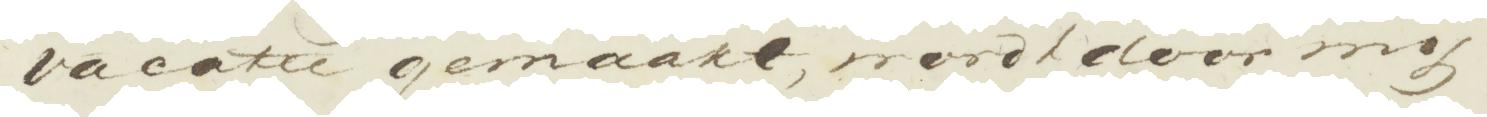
vacatie gemaakt, wordt door my
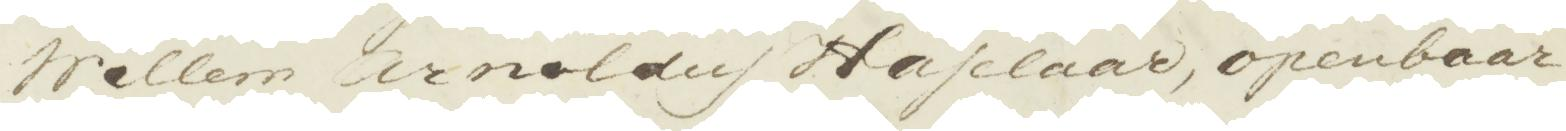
Willem Arnoldus Haselaar, openbaar
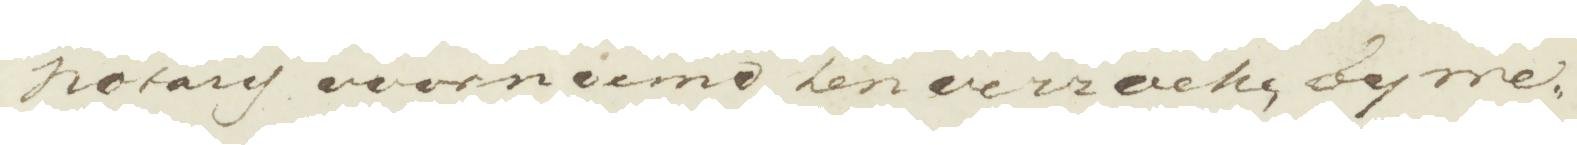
notaris voornoemd ten verzoeke by we„
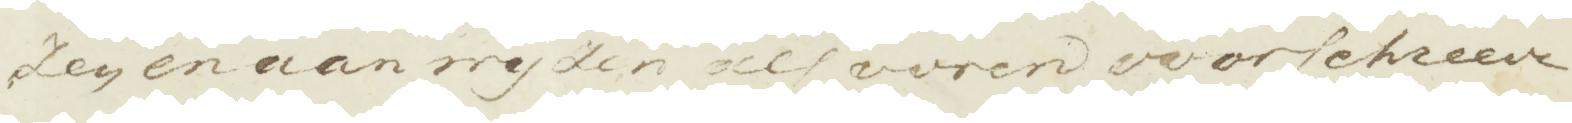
zen en aan wyzen als voren voorschreeve
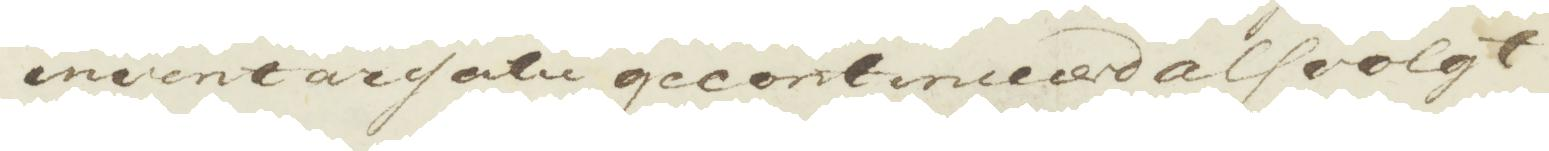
inventarisatie gecontinieerd als volgt
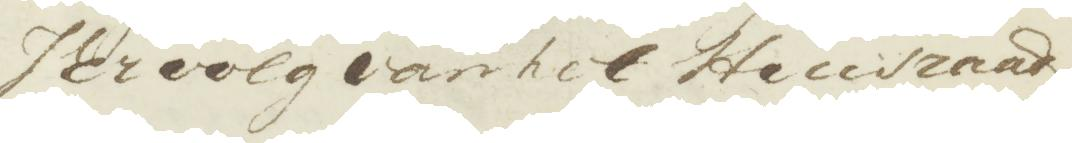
Vervolg van het Huisraad
